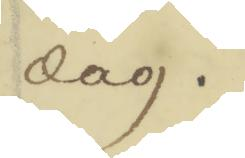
dag.
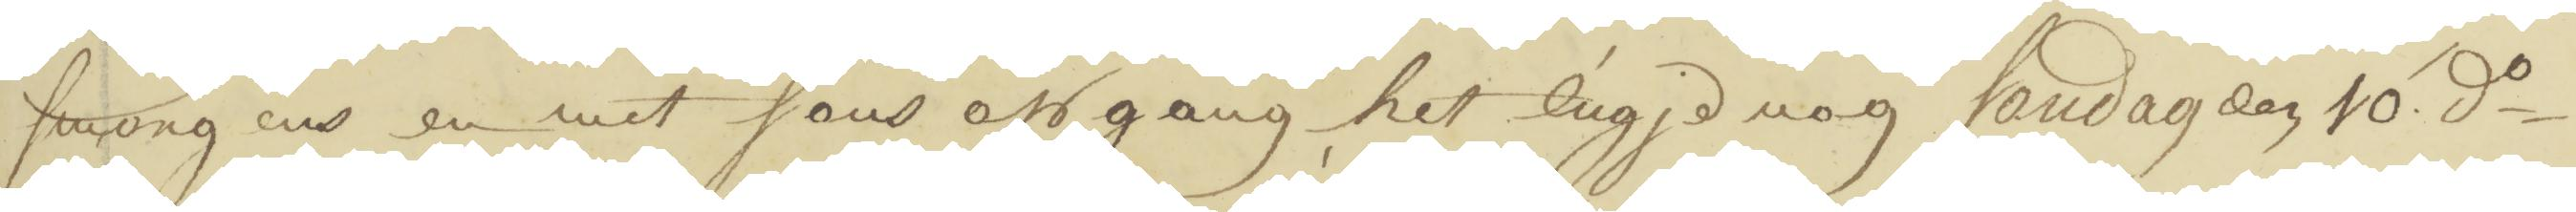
Smorgens en met Sons opgang, het lugje nog Sondag den 10.' d=o
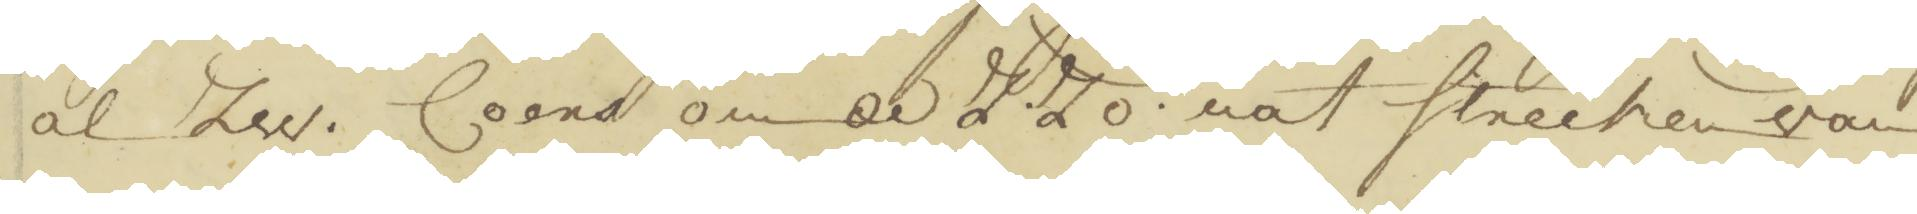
al Ww. Coers om de Z. Zo. na't Strecken van
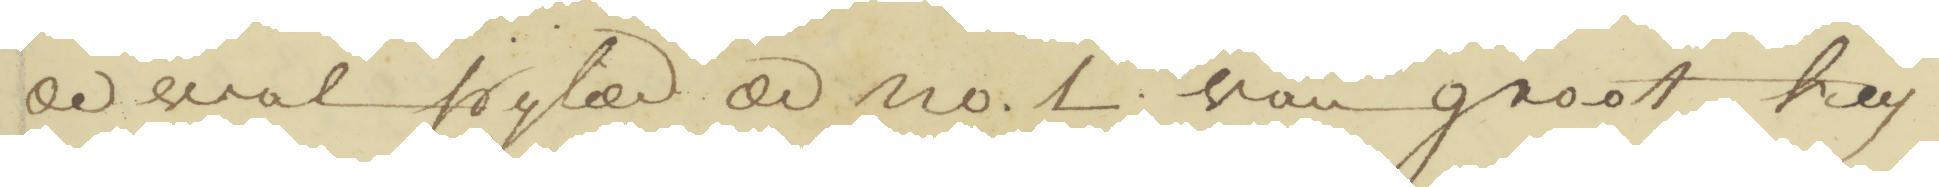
de wal pijlde de no. L. van groot keij
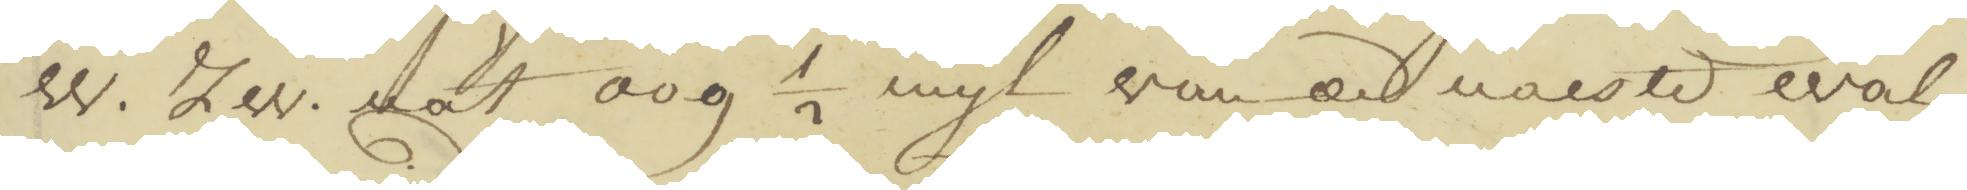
W. Zw. na't oog ½ myl van de naeste wal
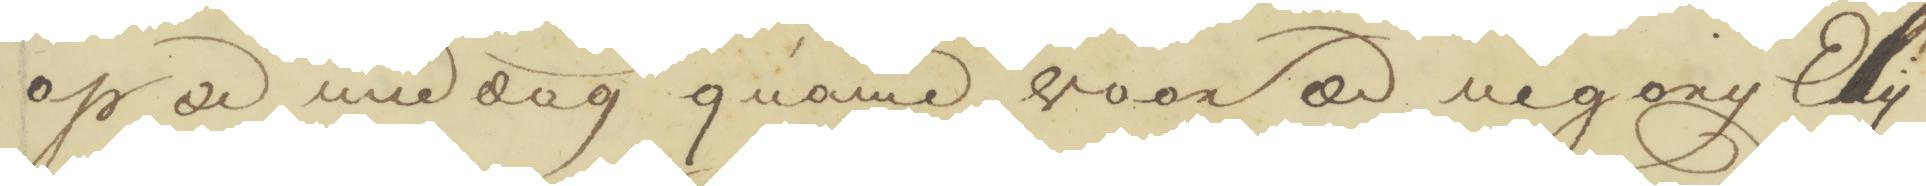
op de middag quame voor de negorij Elij
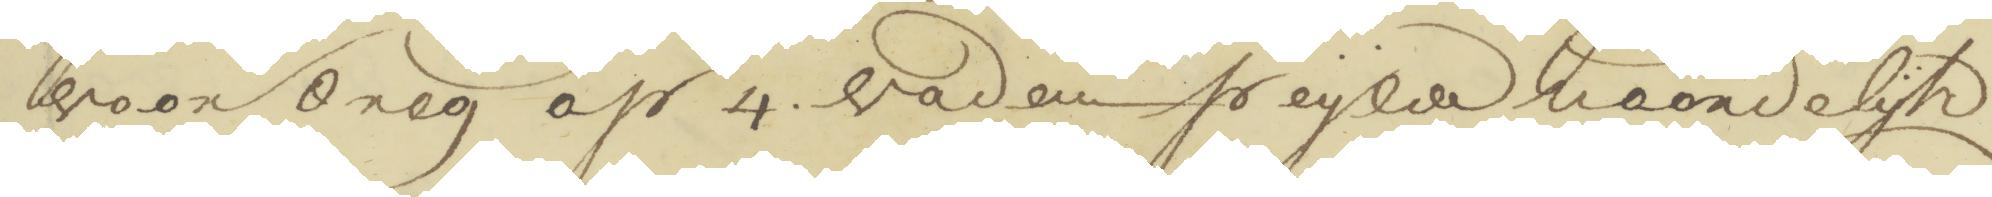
voor dreg op 4. vadem peijlde noordelijk
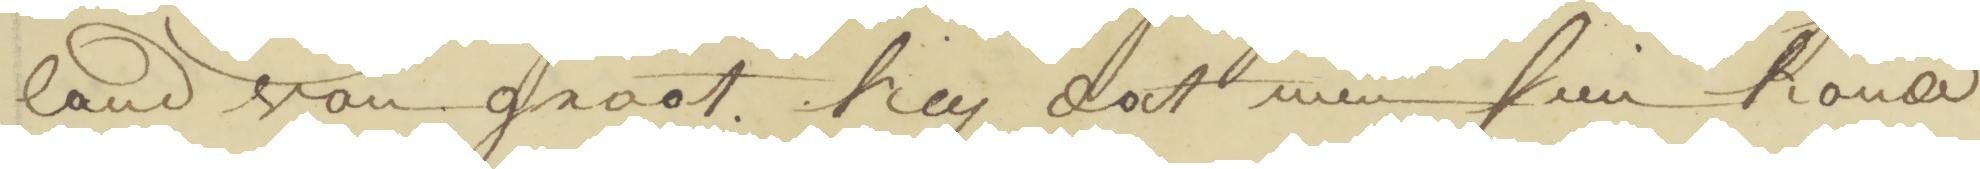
land van groot. keij dat men sien konde
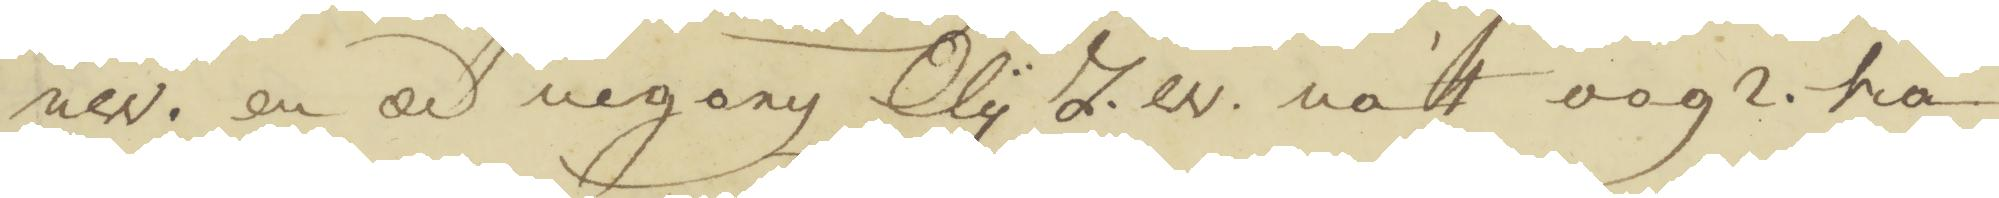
nw. en de negory Olij Z. w. na 't oog 2. ka¬
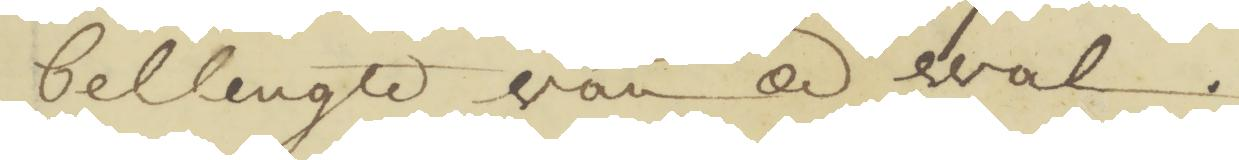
bellengte van de wal.
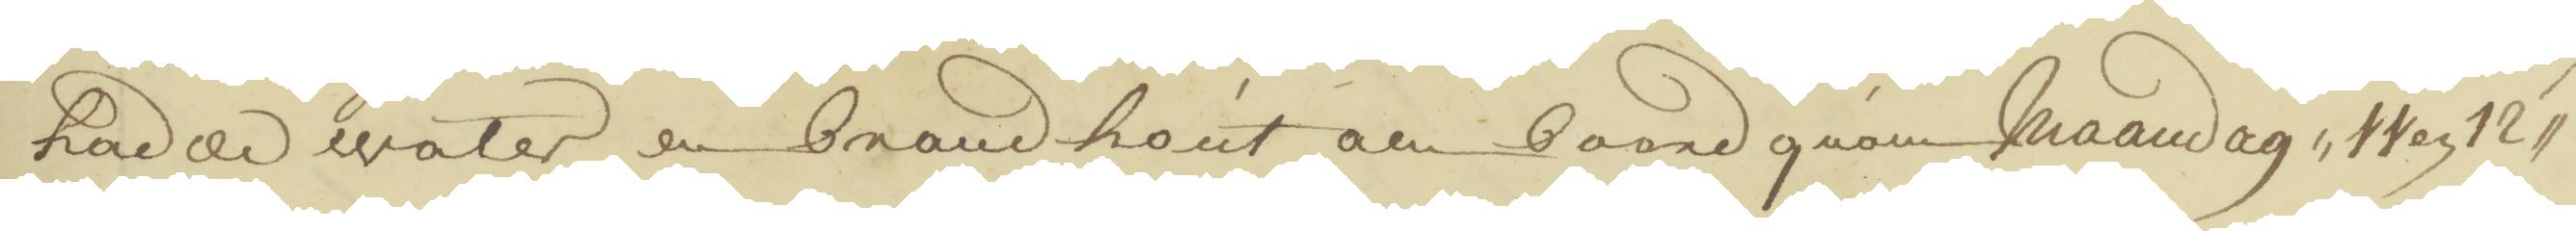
hadde water en brandhout aen boord quam maandag „ 11 en 12„'
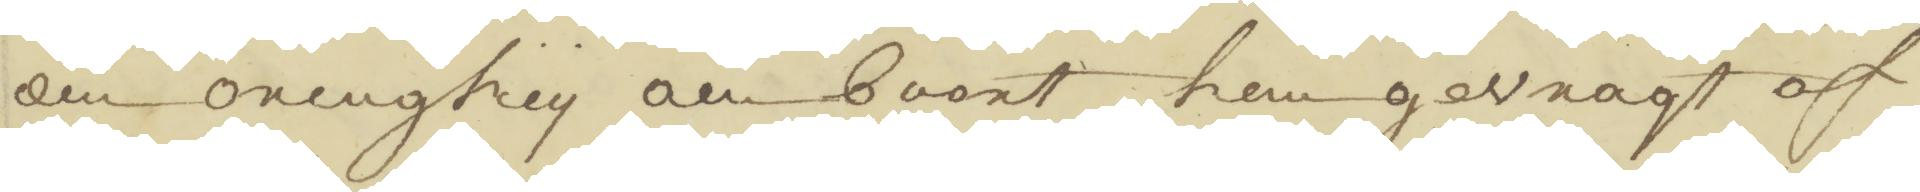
den orengkeij aen boort, hem gevragt of
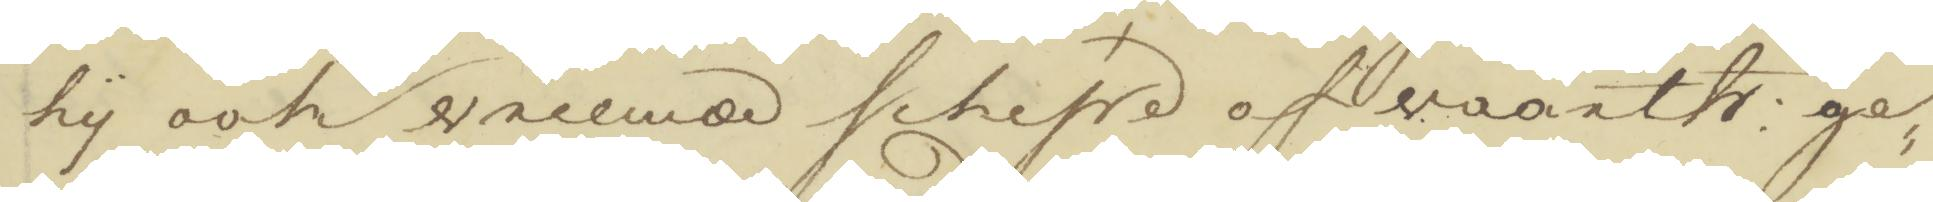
hij ook vreemde schepe af vaarth: ge„
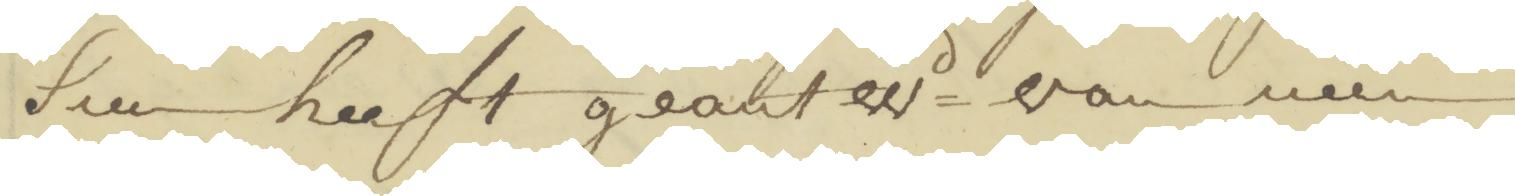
Sien heeft geantw=d van neen
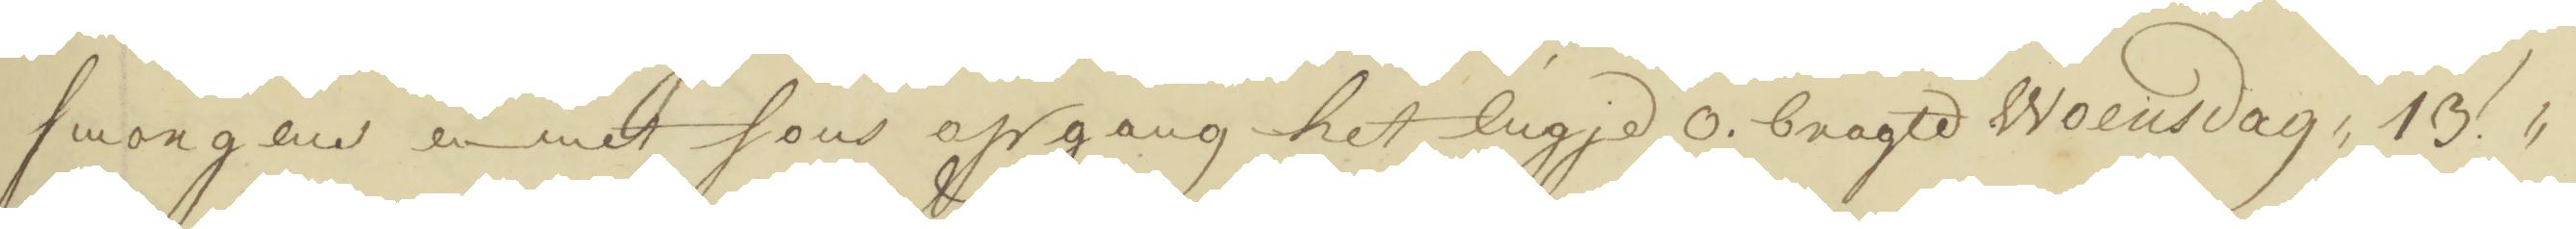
Smorgens en met Sons opgang het lugje O. bragte Woensdag „ 13.' „
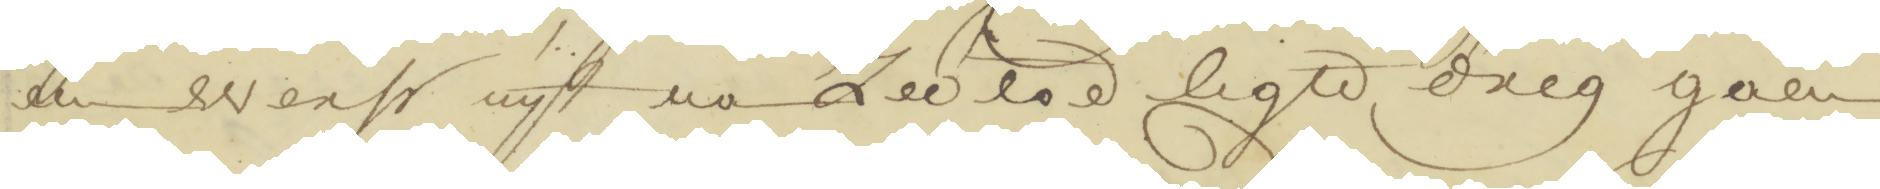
en werst uijt na Zee toe ligte dreg gaen
